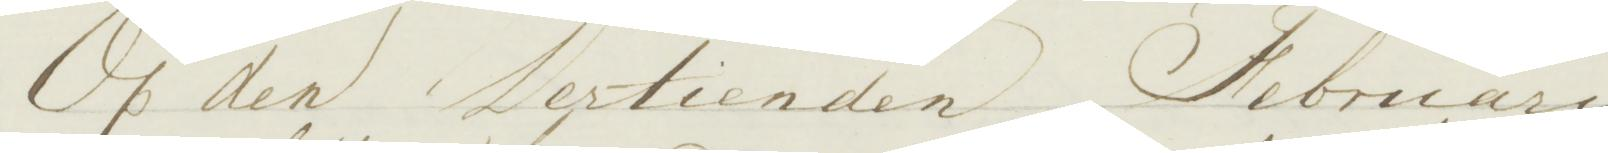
Op den Dertienden Februari
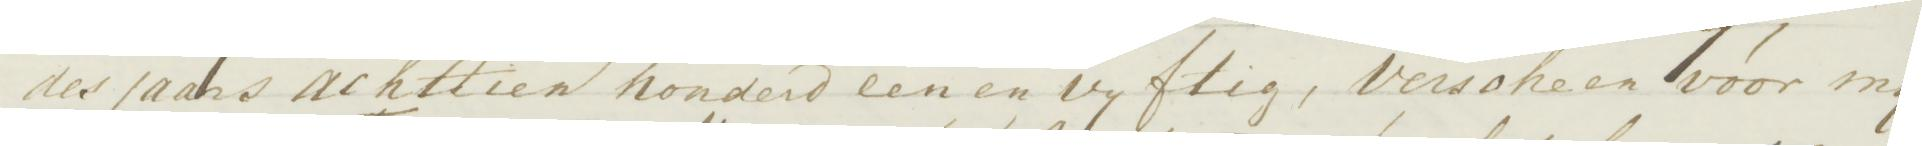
des jaars achttien honderd een en vyftig, verscheen voor my
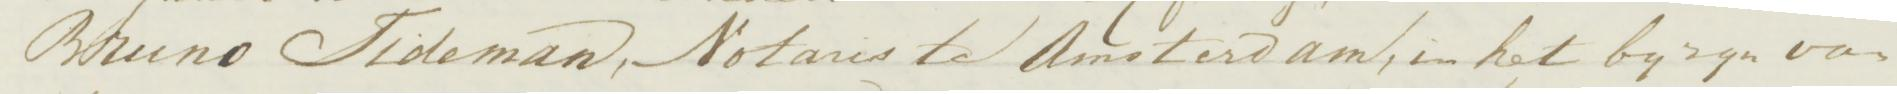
Bruno Tideman, Notaris te Amsterdam, in het by zyn van
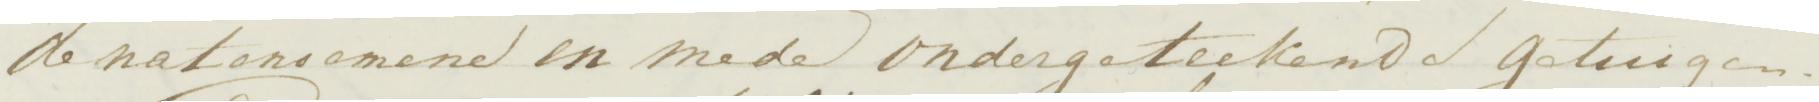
de natenoemene en mede ondergeteekende getuigen
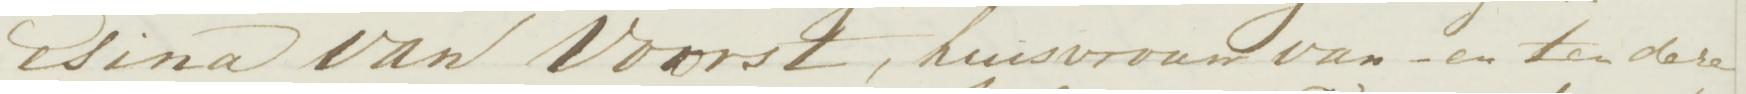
Gesina van Voorst, huisvrouw van -en ten deze
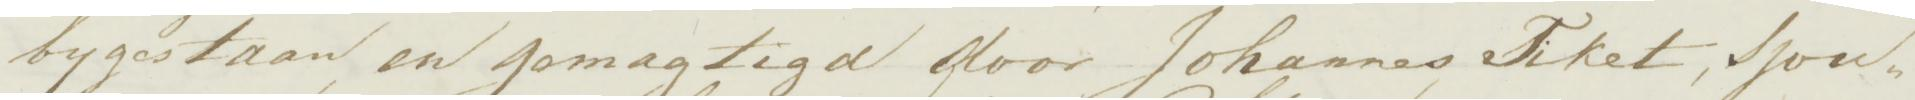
bygestaan en gemagtigd door Johannes Tiket, sjou„
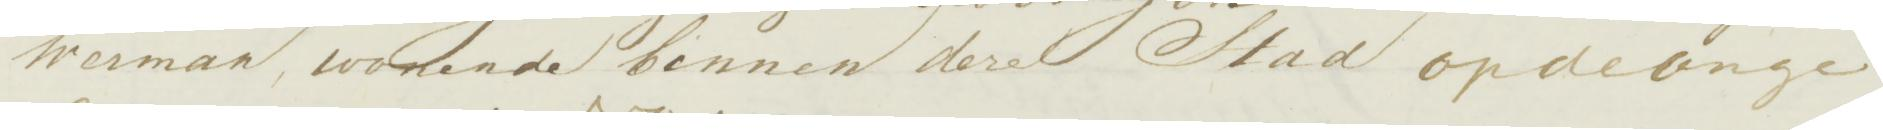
werman, wonende binnen deze Stad op deange
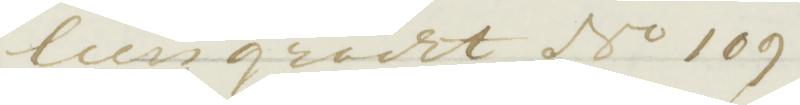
liersgracht No 109
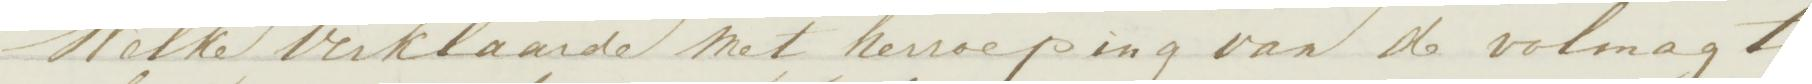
Welke verklaarde met herroeping van de volmagt
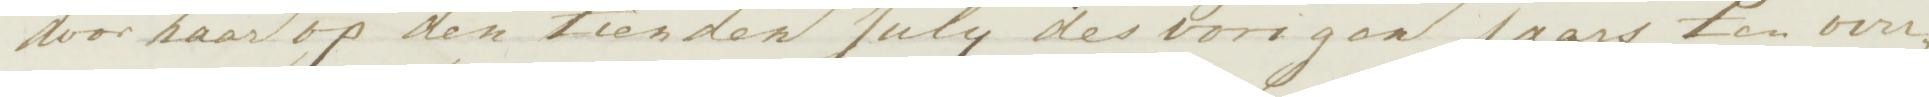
door haar op den tienden July des vorigen jaars ten over„
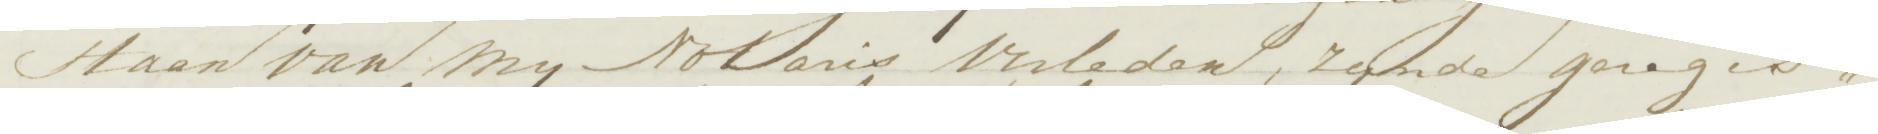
staan van my Notaris verleden, zynde geregis„
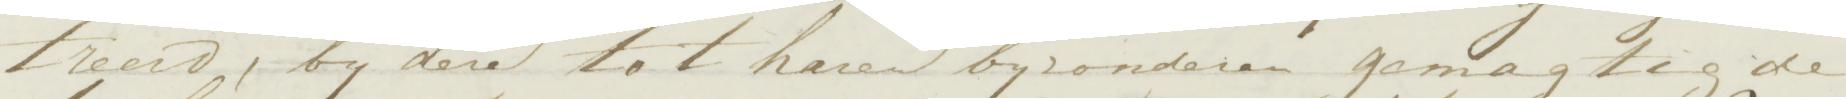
treerd, by deze tot haren byzonderen gemagtigde
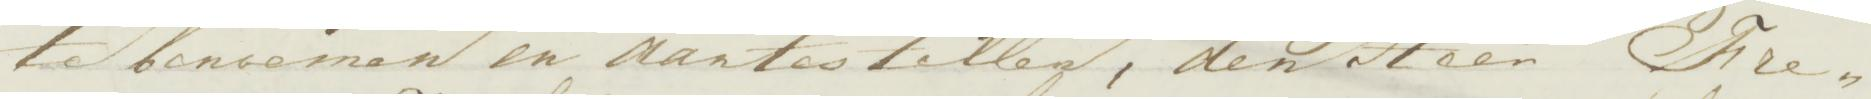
te benoemen en aantestellen, denHeer Fre„
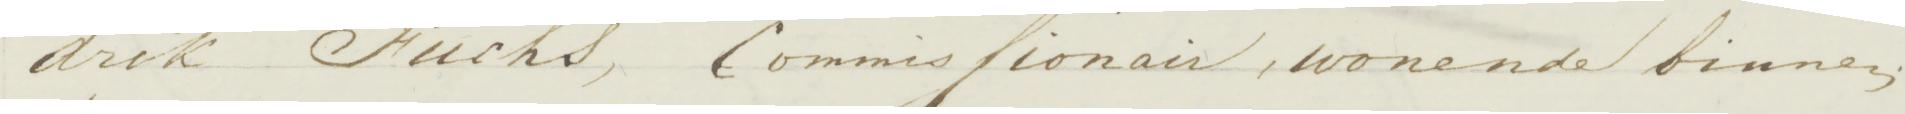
drik Fuchs, Commissionair, wonende binnenn
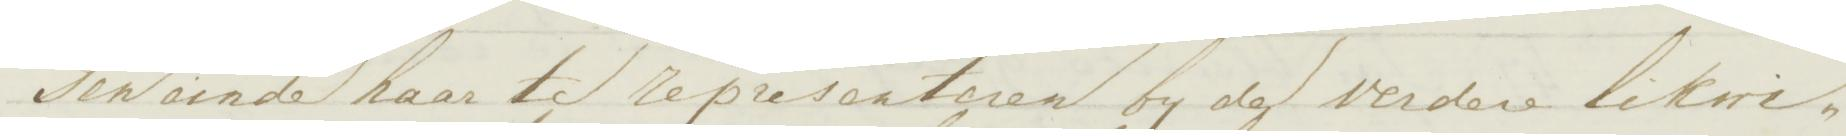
Ten einde haar te representeren by de verdere likwi„
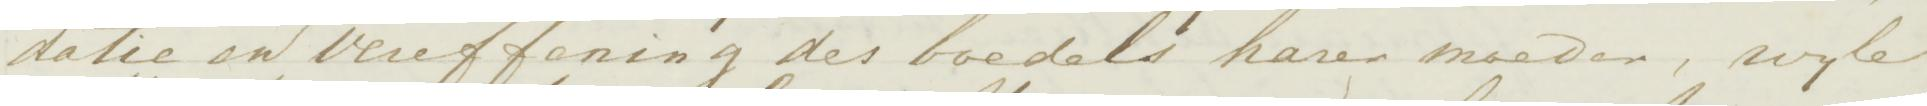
datie en vereffening des boedels harer moeder, wyle
